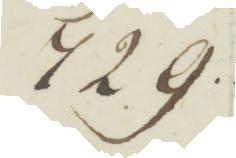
729. -. -.
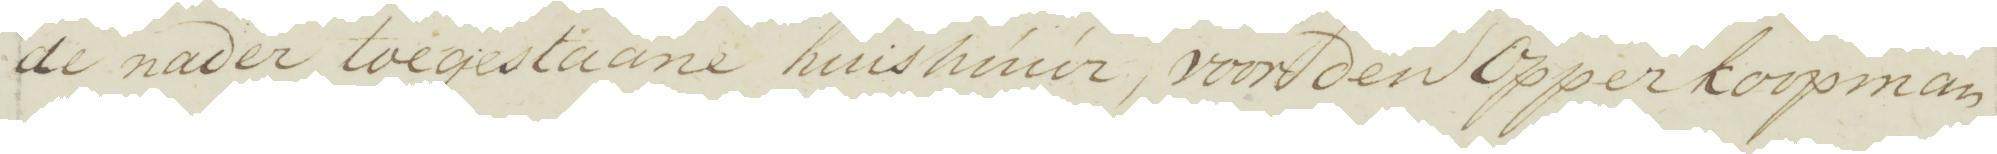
de nader toegestaane huishuur, voor den Opperkoopman
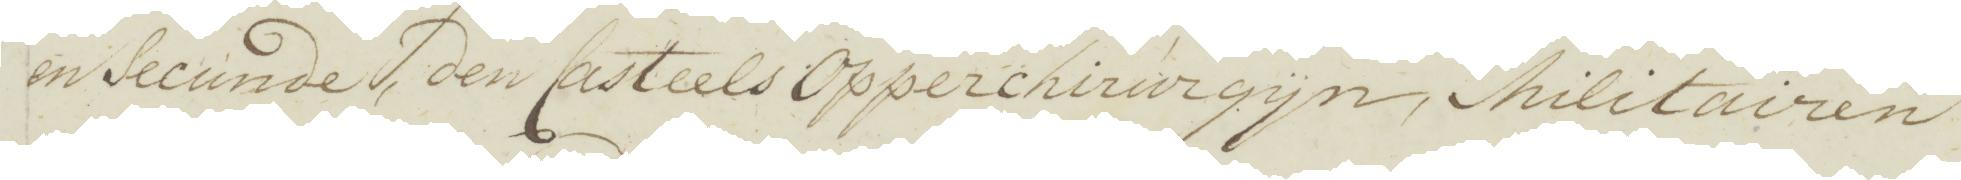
en Secunde, den Casteels Opperchirurgijn, Militairen
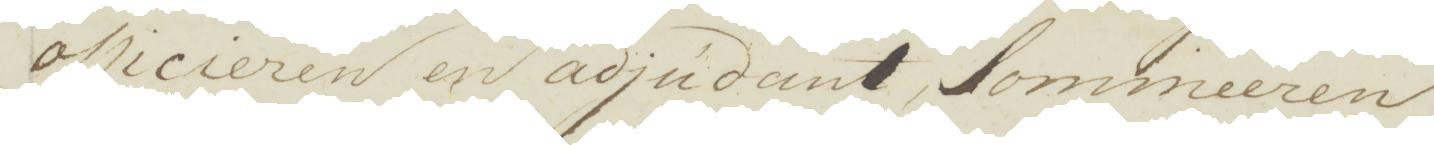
officieren en adjudant, Sommeeren
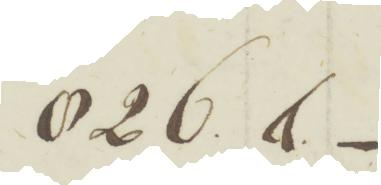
„ 826. 4. - .
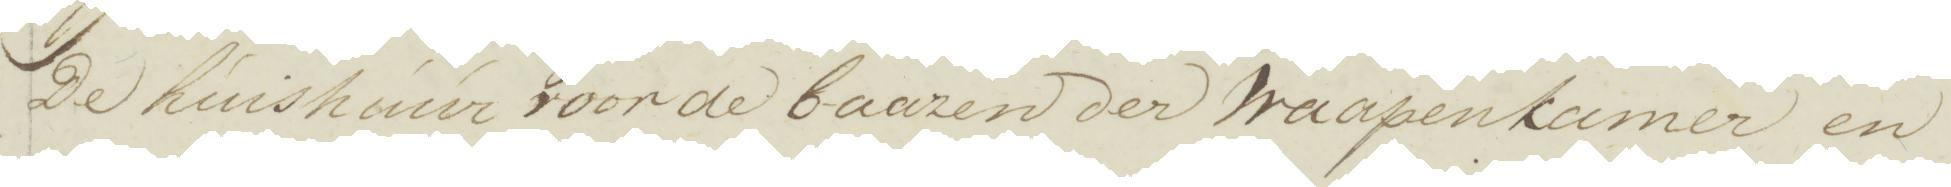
De huishuur voor de baazen der waapenkamer en
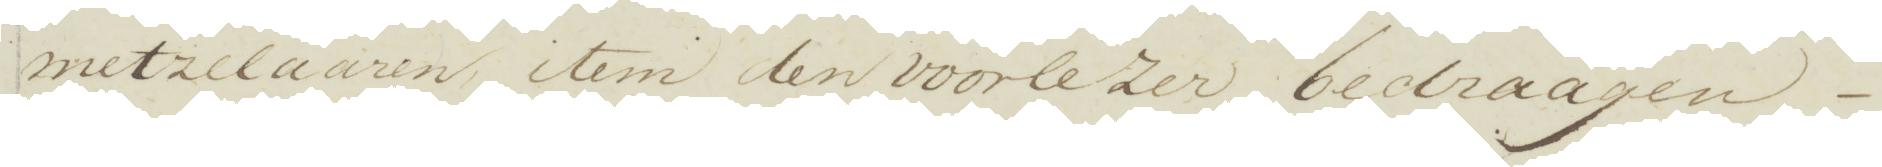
metzelaaren, item den voorlezer bedraagen -
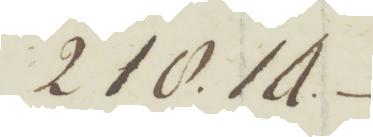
„ 218.14: - .
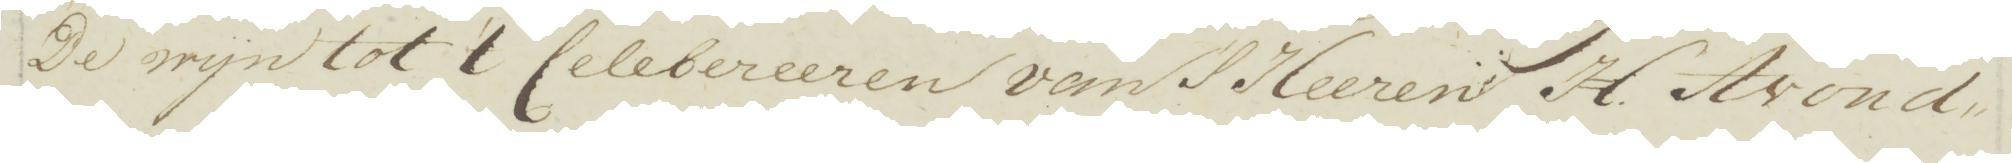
De wijn tot ’t Celebereeren van 'S Heeren H. Avond„
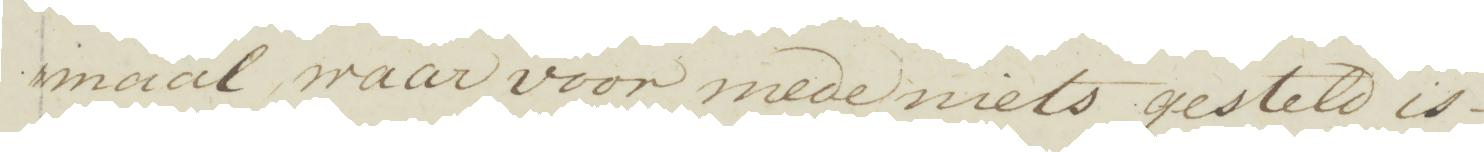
„maal, waar voor mede niets gesteld is
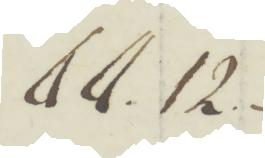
44. 12. -.
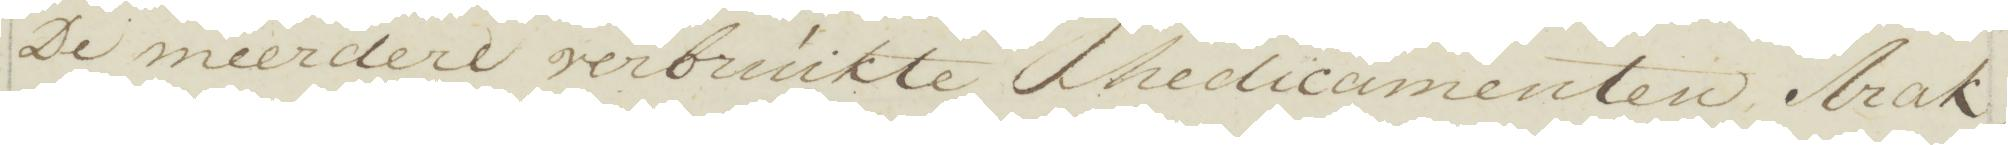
De meerdere verbruikte Medicamenten, Arak
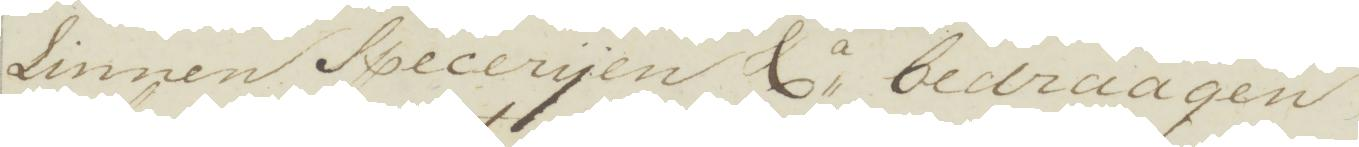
Linnen Specerijen &„a bedraagen
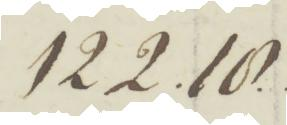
122: 18. - .
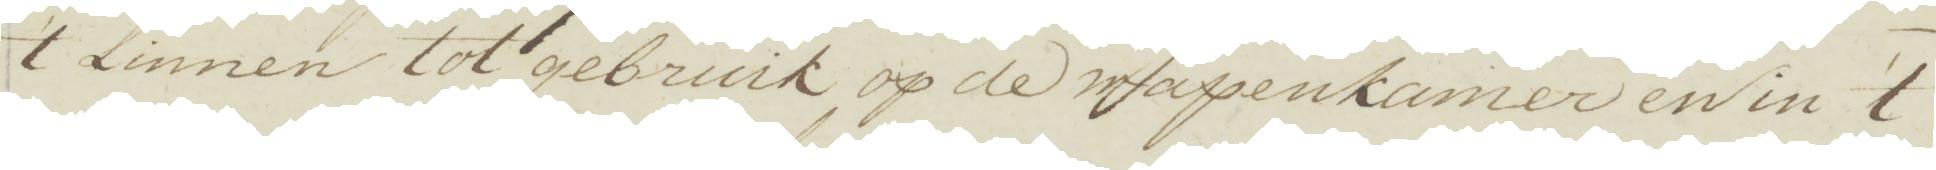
’t Linnen tot gebruik op de apenkamer en in ’t
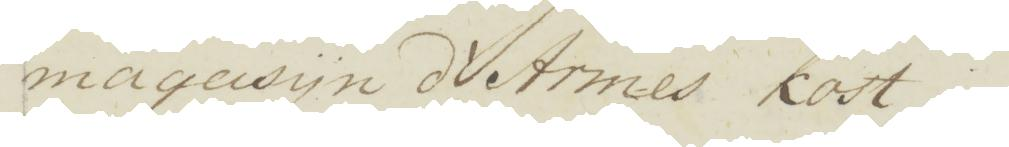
magasijn d' Armes kost
